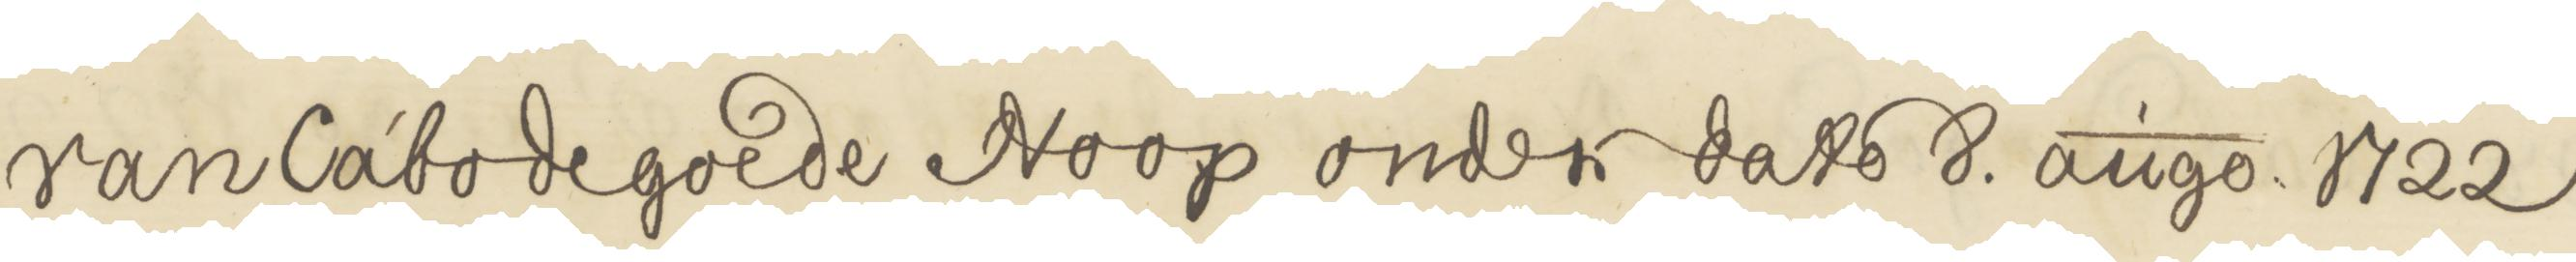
van Cabo de goede Hoop onder dato 8. augo: 1722
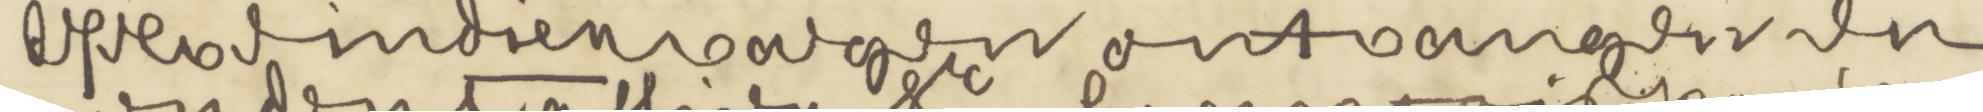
deselve indiervoegen ontvangen en
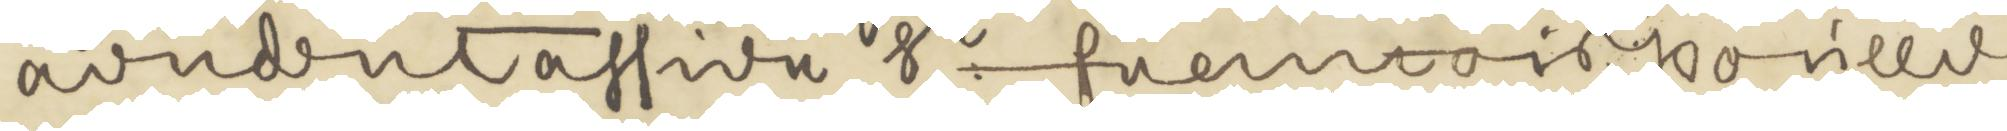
aen den Cassier s:r francois poulle
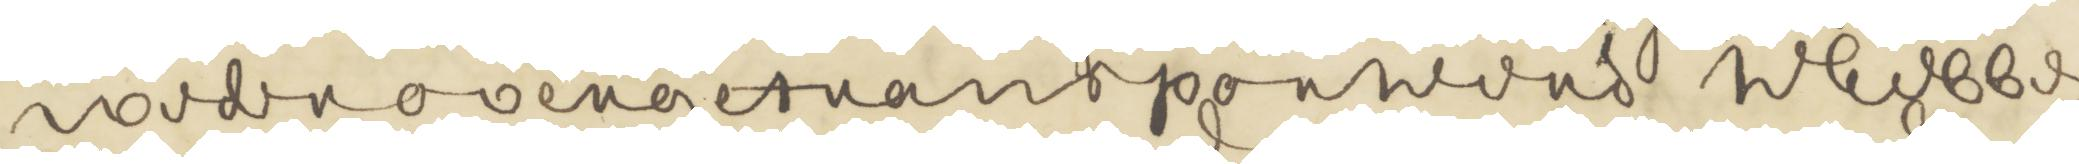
weder overgetransporteerd te hebben
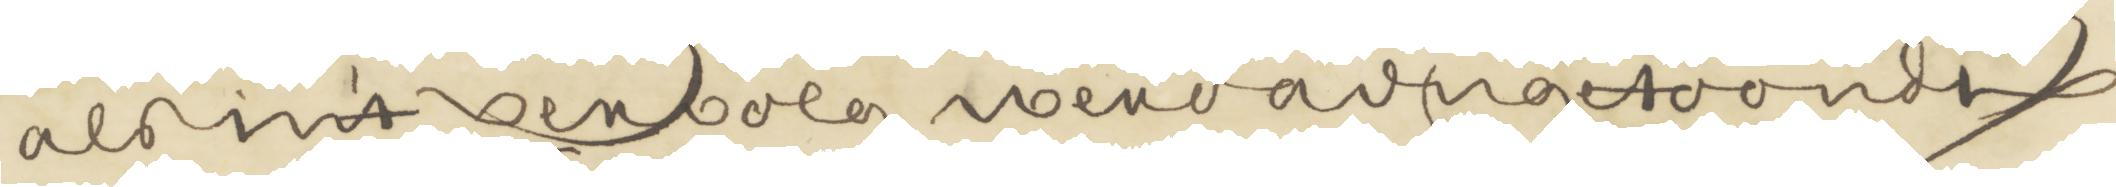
als in't vervolg werd aengetoondt
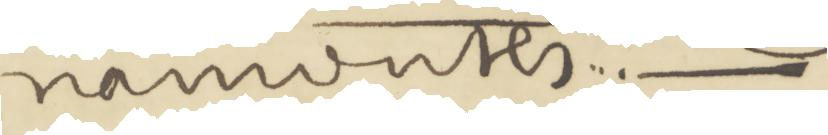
namentlijk. —
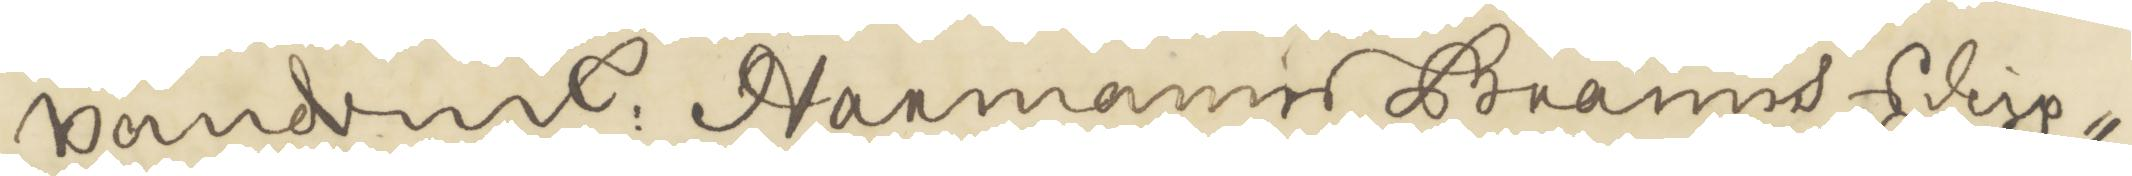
van den E: Harmanus Branus schip„
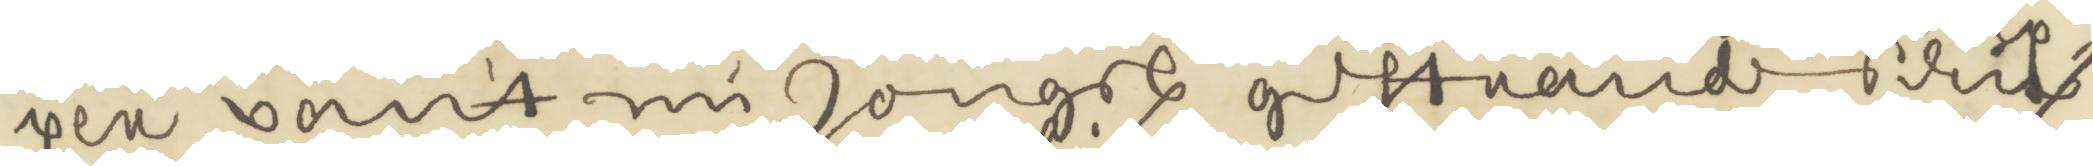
per van’t nu Jongst gestrande schip
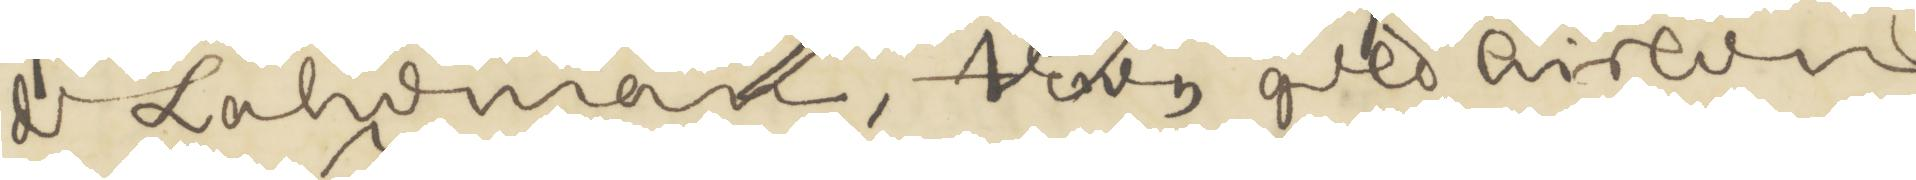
de Lakeman, thien geld kisten
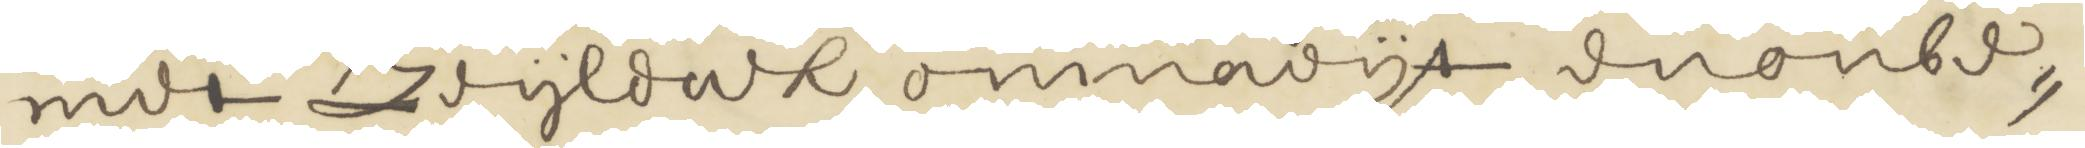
met zeijldoek omnaeijt en onbe„
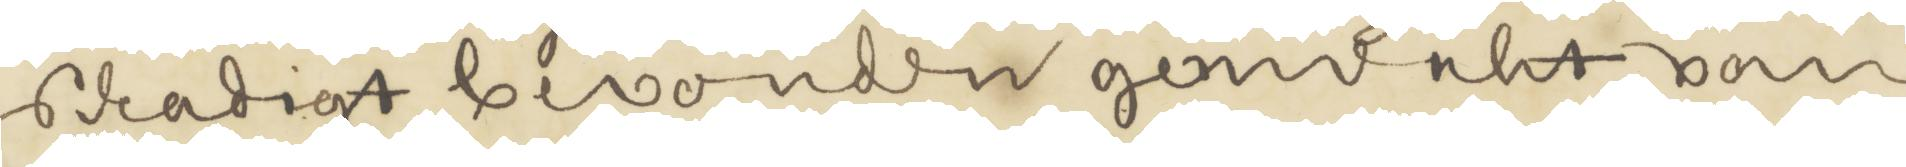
schadigt bevonden gemerkt van
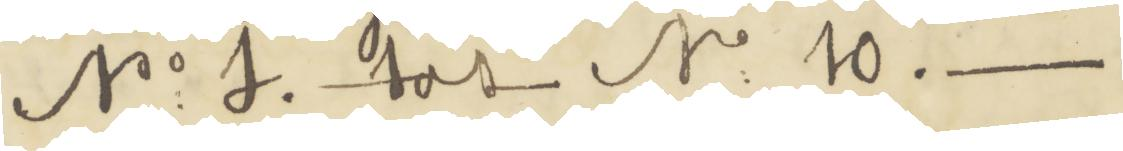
N:o 1. tot N:o 10. —
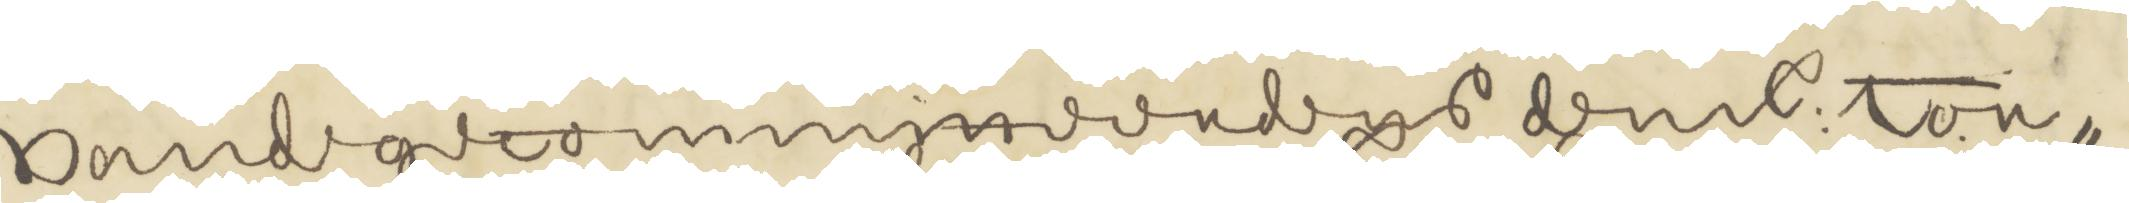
van de gecommitteerdens den E: Cor„
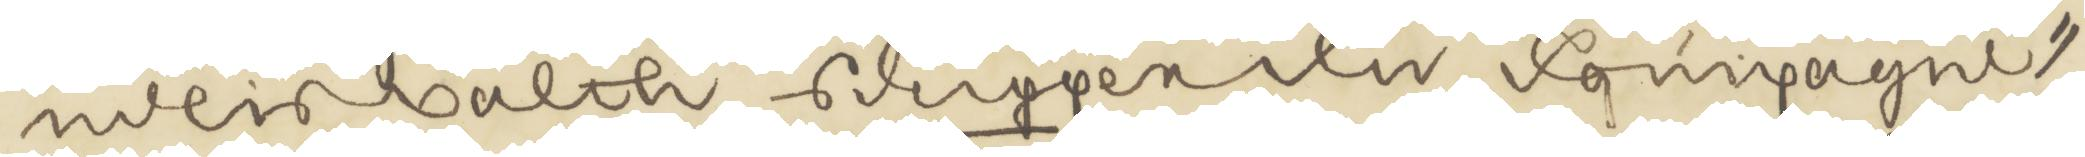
nelis valck schipper En Equipagie
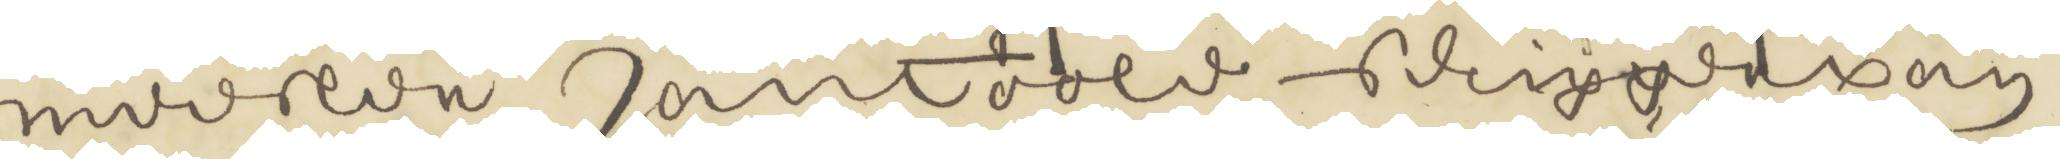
meester, Jan Coole schipper van
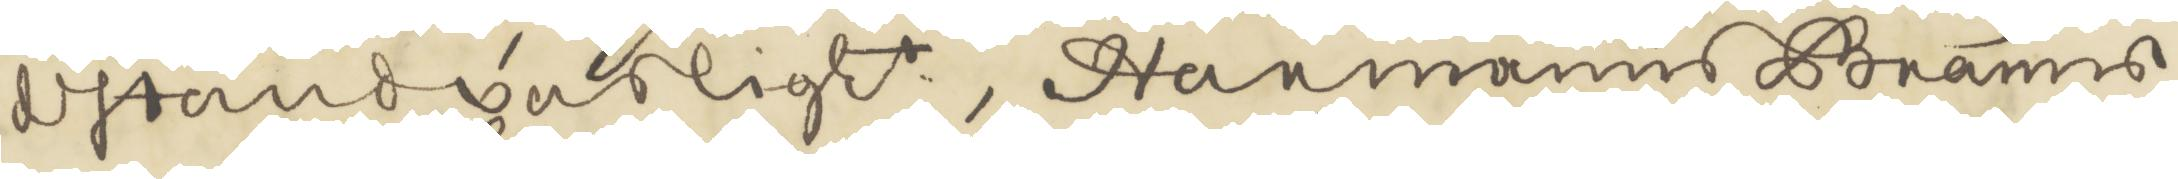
de standvastigh:t, Harmanus Branus
